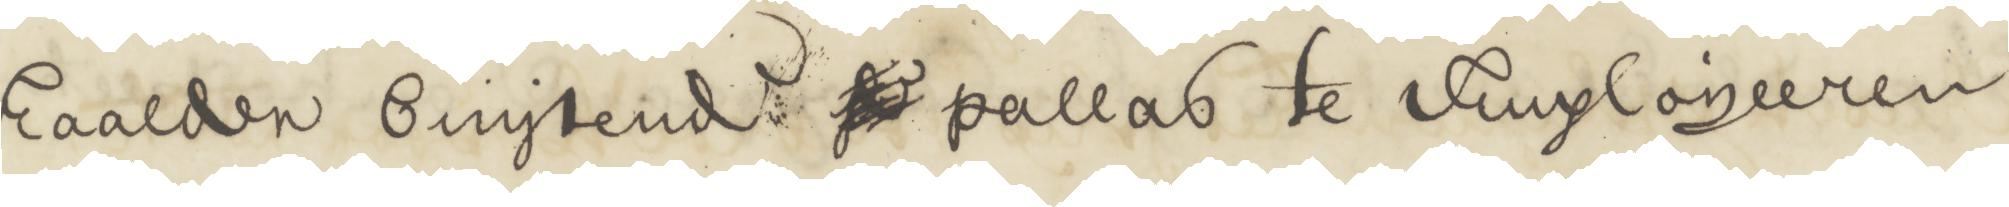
haalder buijtende pe pallas te Emploijeeren
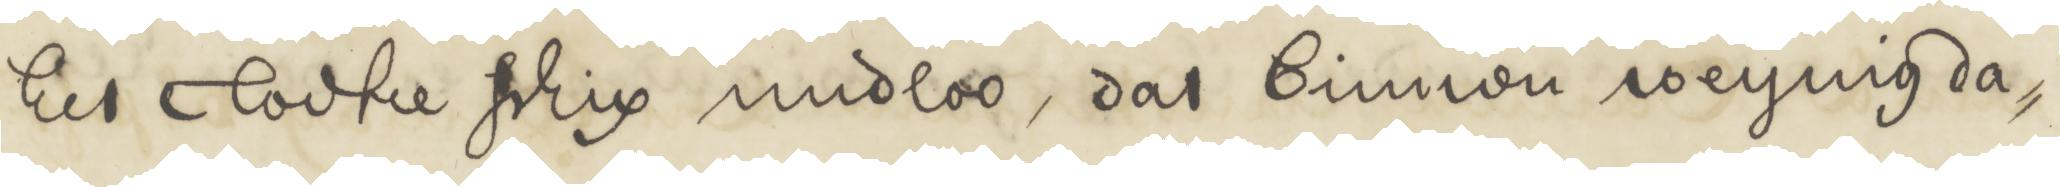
het cloeke schip midloo, dat binnen weynig da„
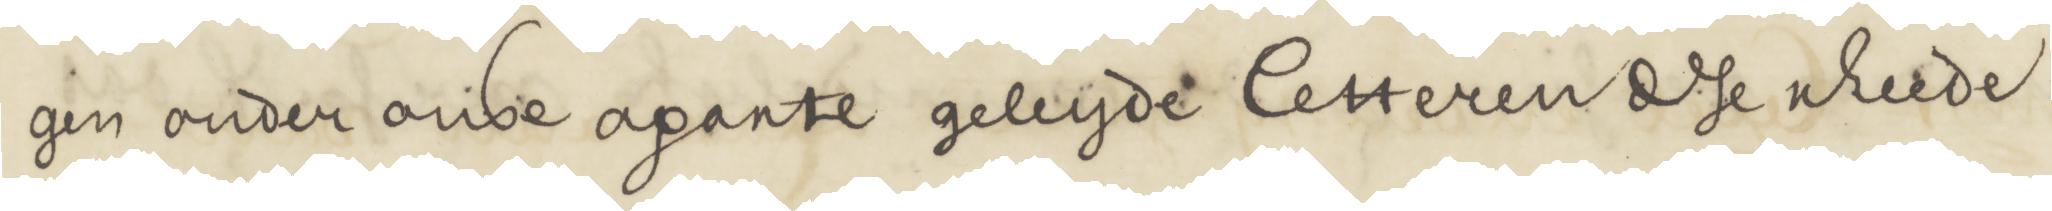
gen onder onse aparte geleijde letteren dese rheede
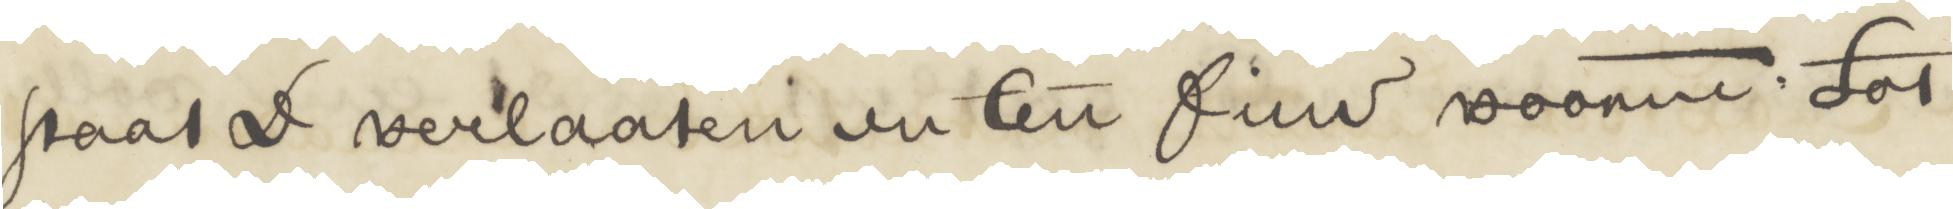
staat te verlaaten en ten fine voorm. tot
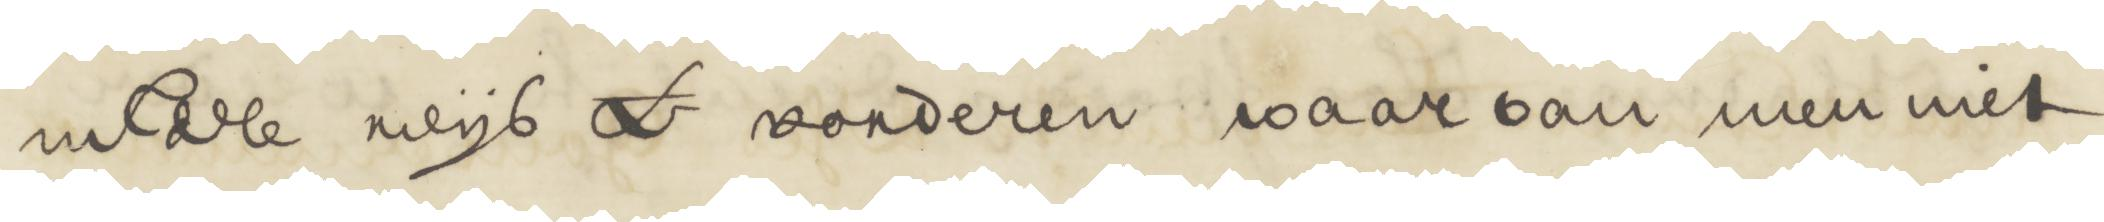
uEdele reijs te vorderen waar van men niet
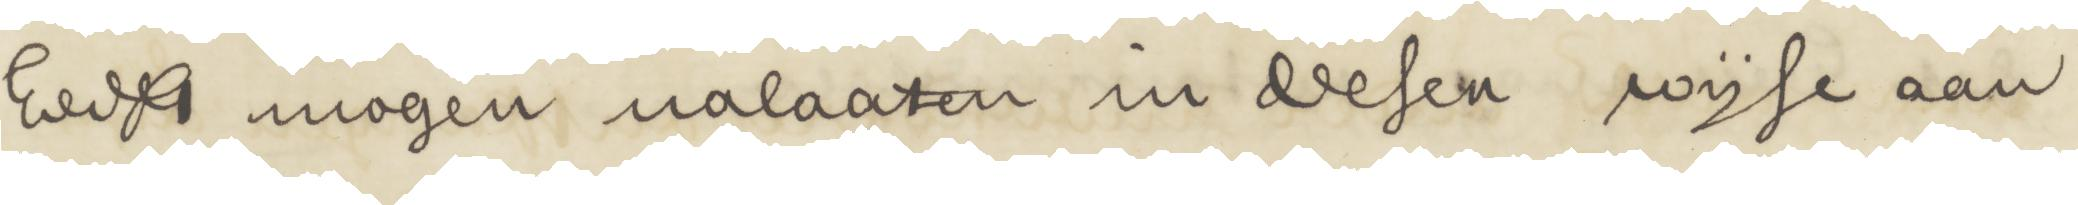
heeft mogen nalaaten in deeser wijse aan
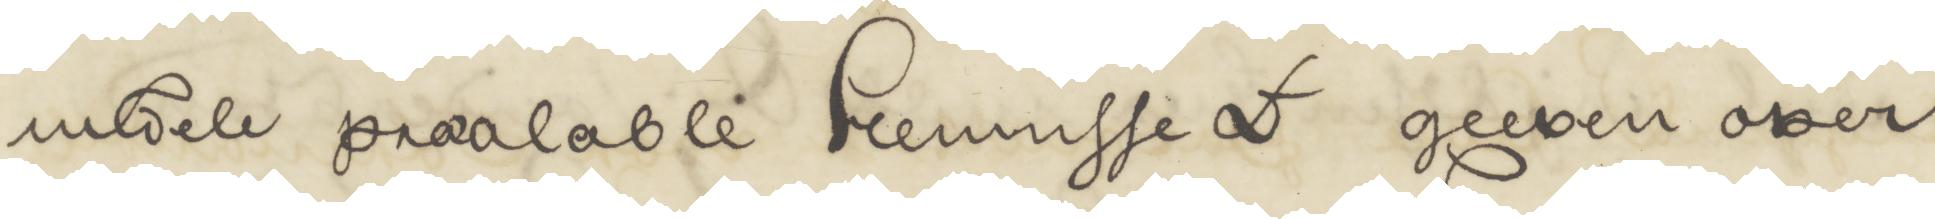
uEdele praealable kennisse te geeven over
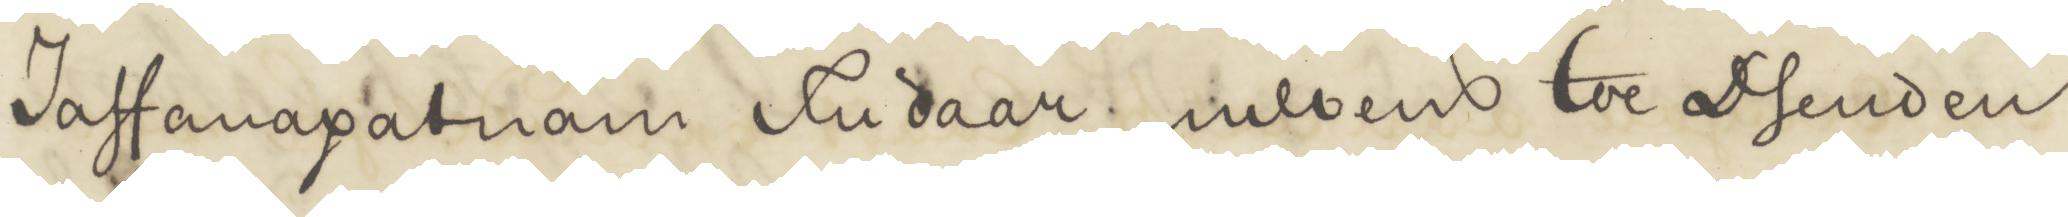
Iaffanapatnam En daar nevens toe te senden
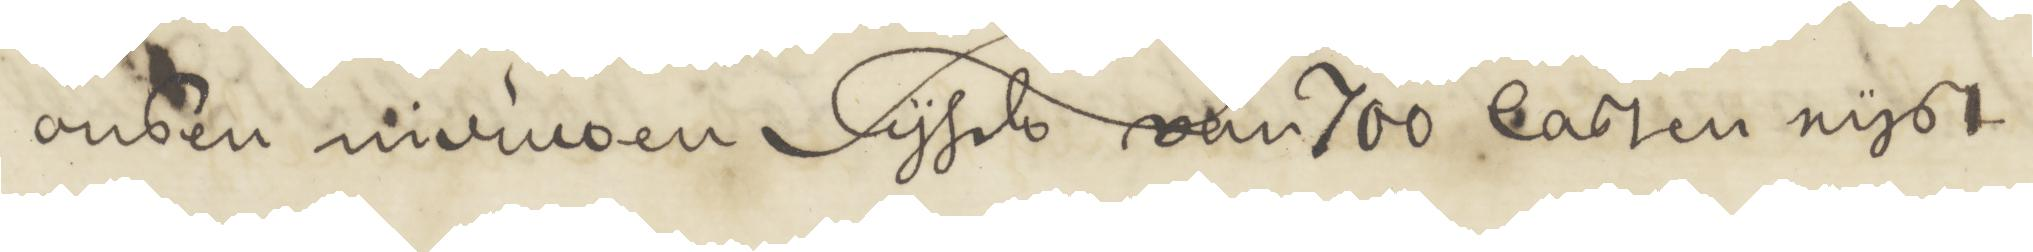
onsen nieuwen Eijsch van 700 lasten rijst
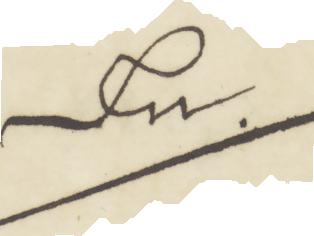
En.
